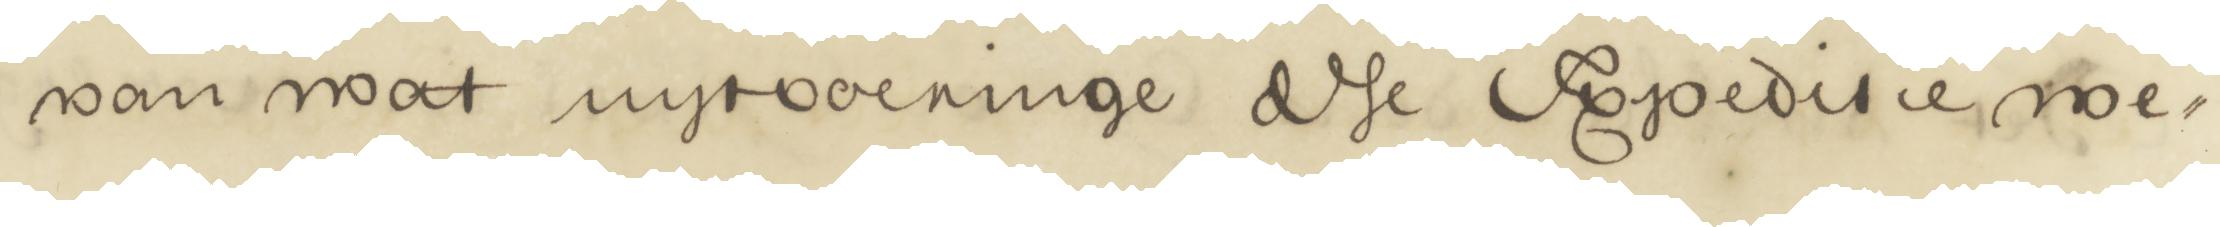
van wat uytvoeringe dese Expeditie we„
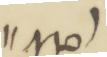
„w'
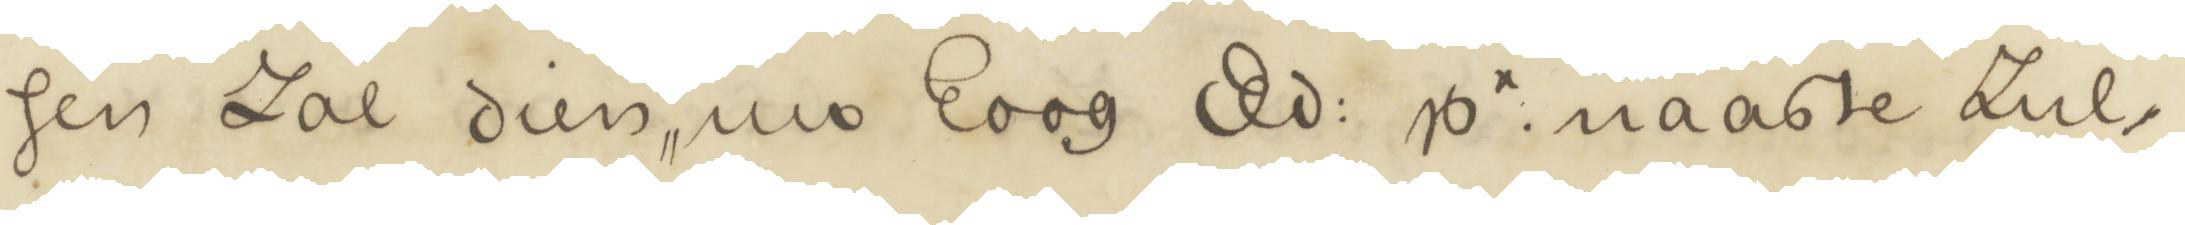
sen zal dien „uw hoog Ed: p:r naaste zul„
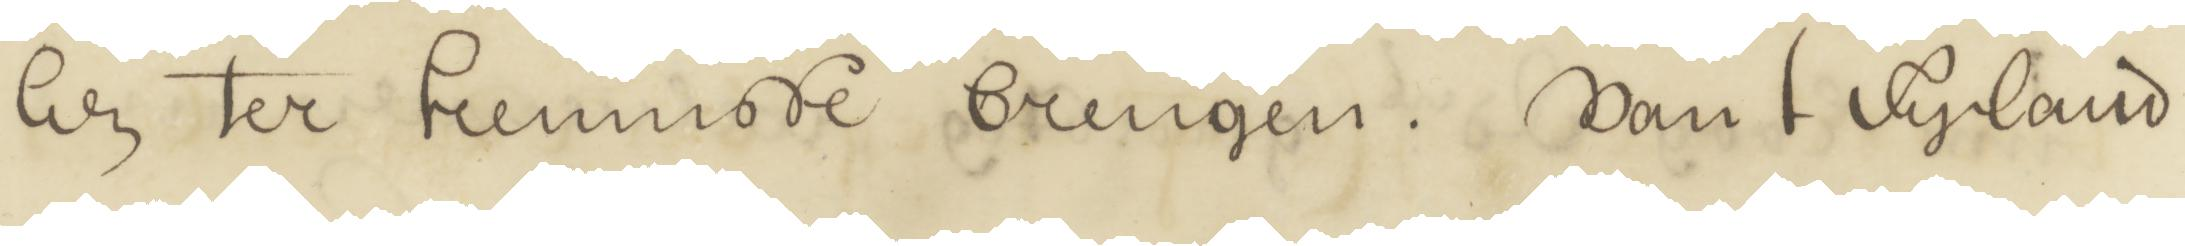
len ter kennisse brengen. van t Eyland
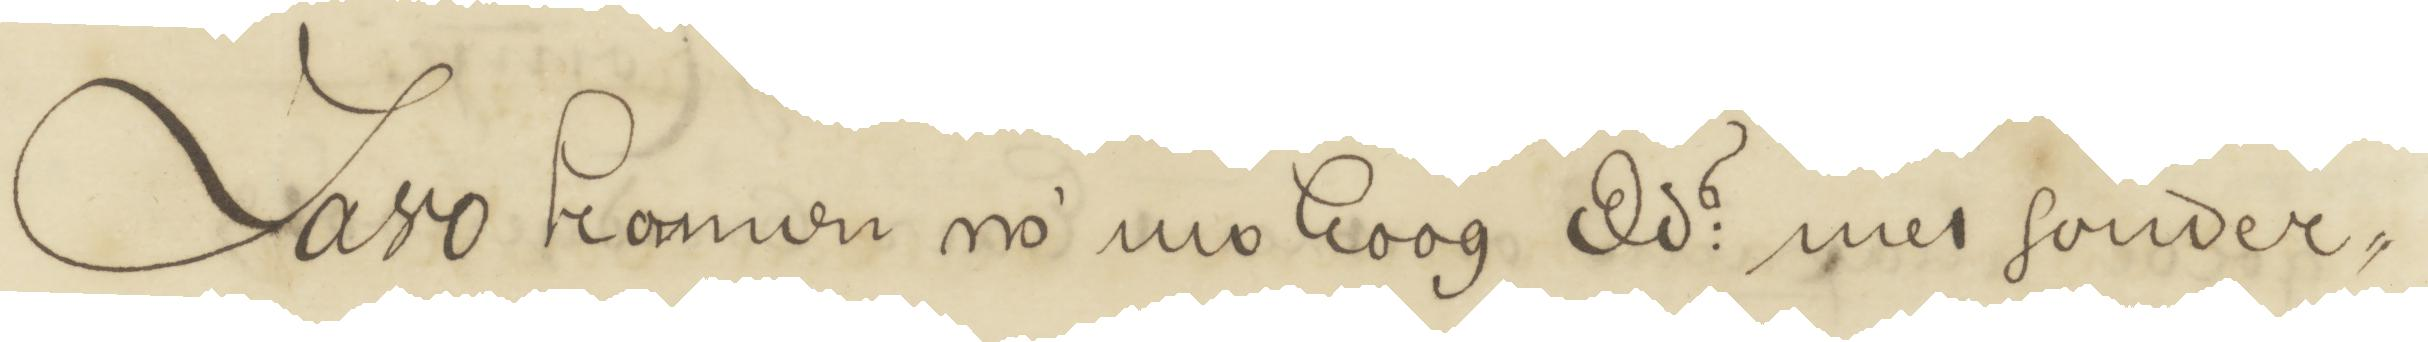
Savo kamen w' uw hoog Ed:s niet sonder„
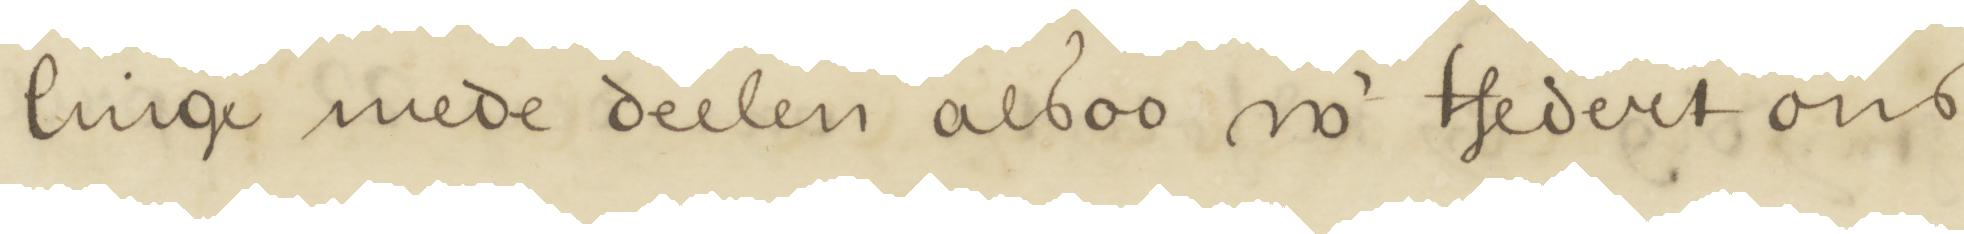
linge mede deelen alsoo w' tsedert ons
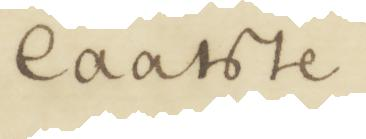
laatste
